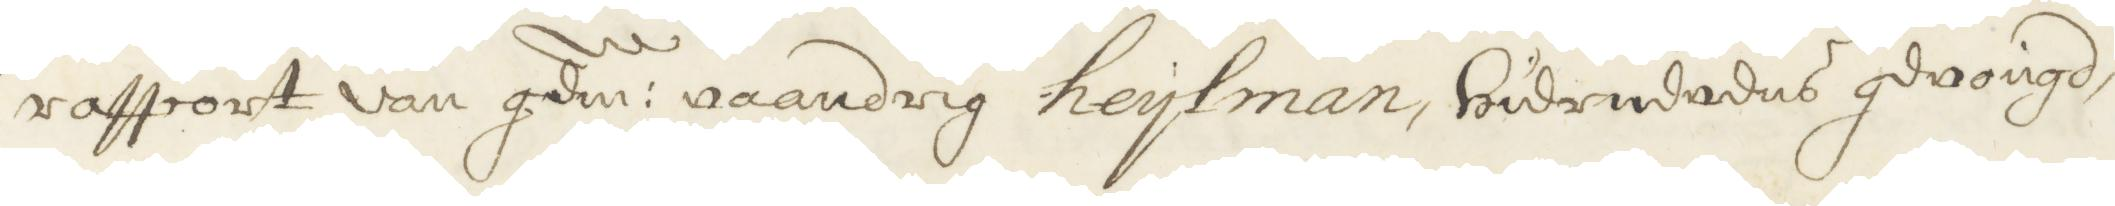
rapport van gem:e vaandrig heijlman, hiernevens gevougd,
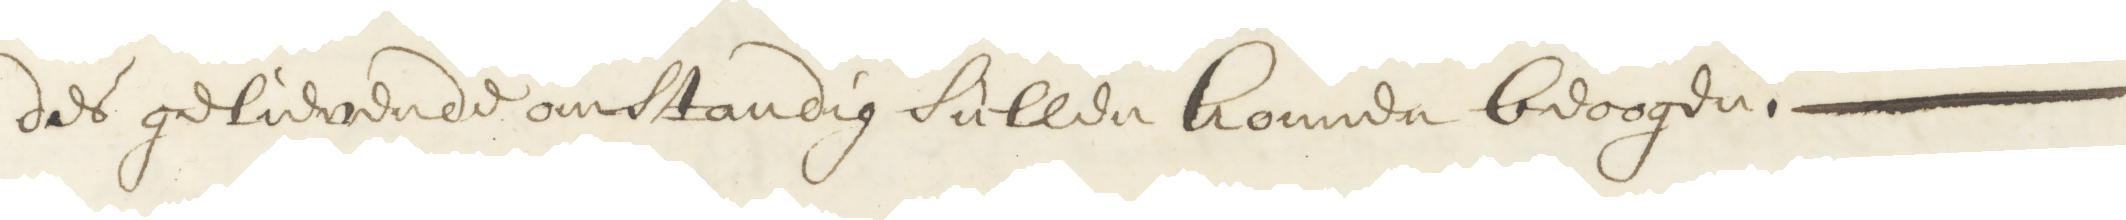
des gelievende omstandig sullen konnen beoogen. —
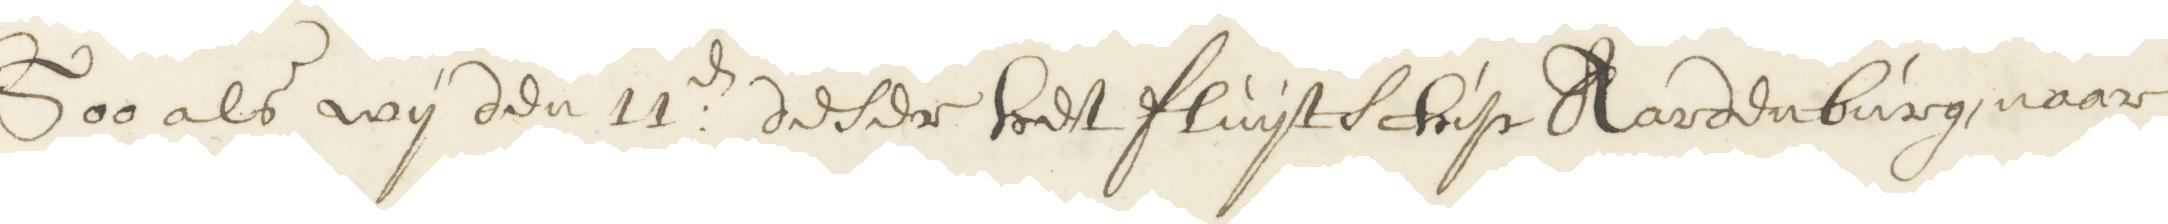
Soo als wij den 11:en deser het fluijtschip Aardenburg, naar
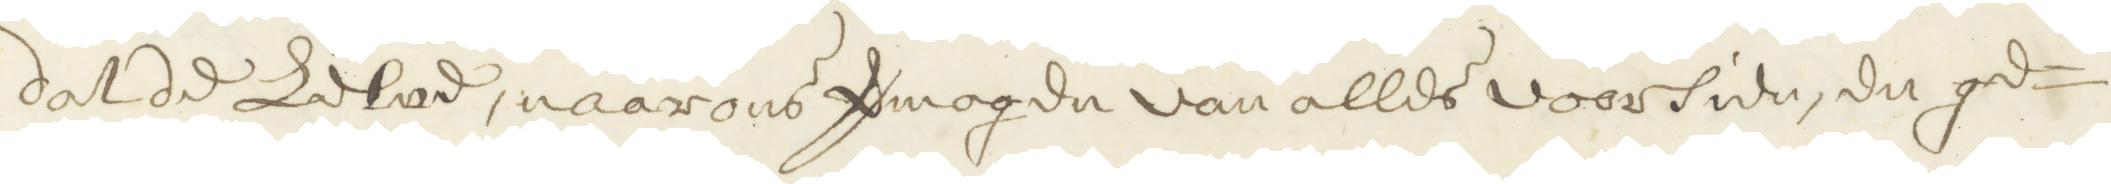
dat de zelve, naar ons vermogen van alles voorsien, en ge„
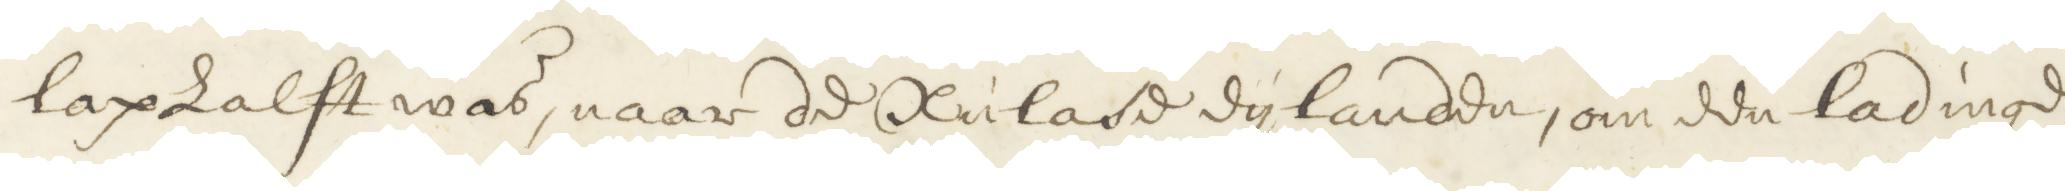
lapzalft was, naar de Xulase eijlanden, om een ladinge
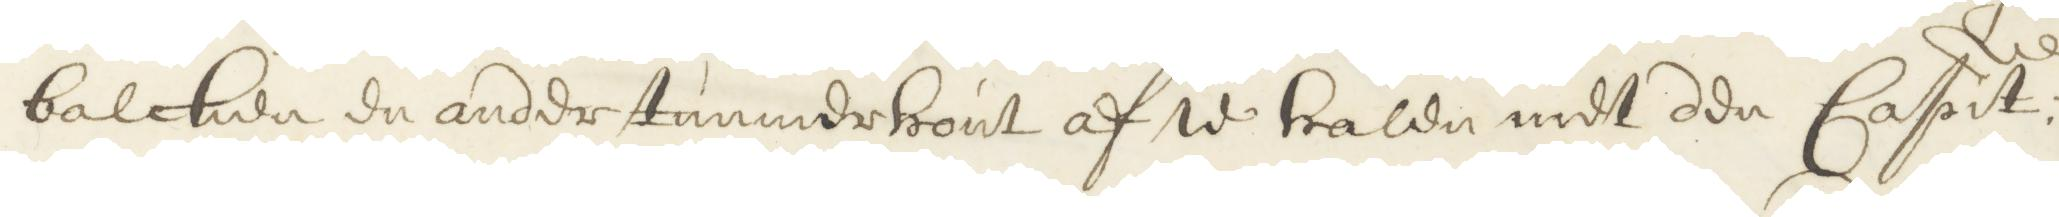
balcken en ander timmerhout af te halen met den Capit:e
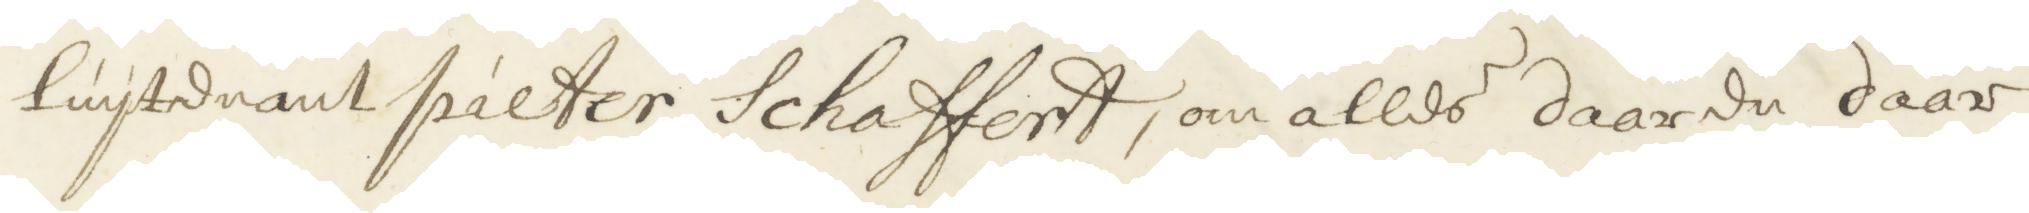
luijtenant pieter schaffert, om alles daar en daar
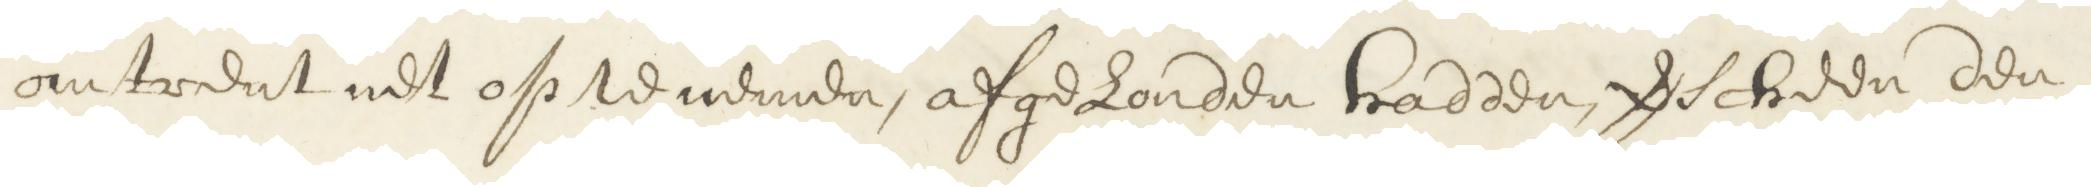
omtrent net op te nemen, afgezonden hadden, verscheen den
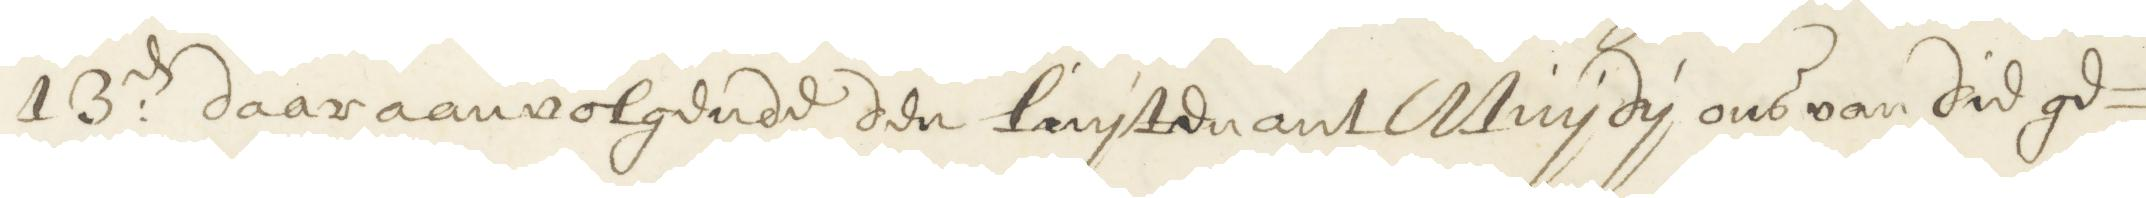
13:en daar aan volgende den luijtenant Muijdij ons van die ge„
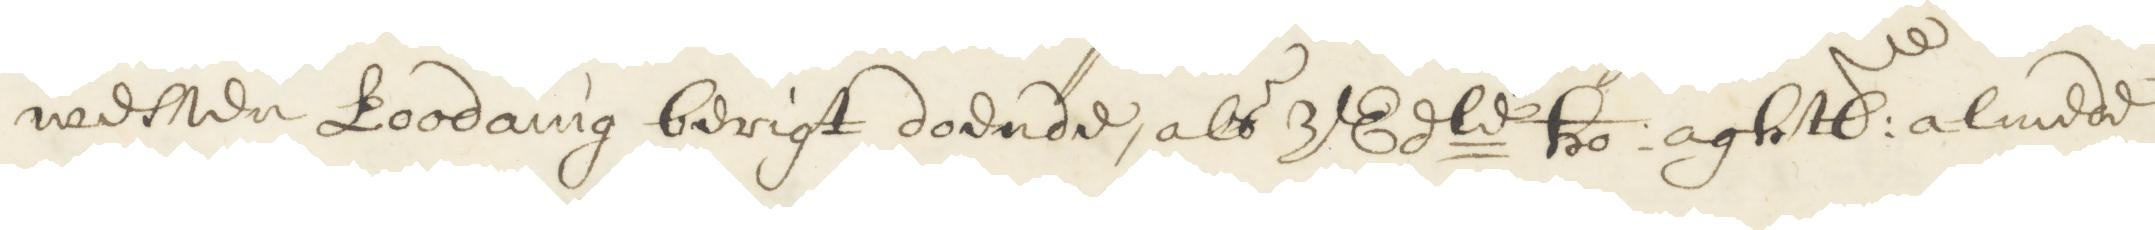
westen zoodanig berigt doende, als VEd=le ho: aghtb:e almede
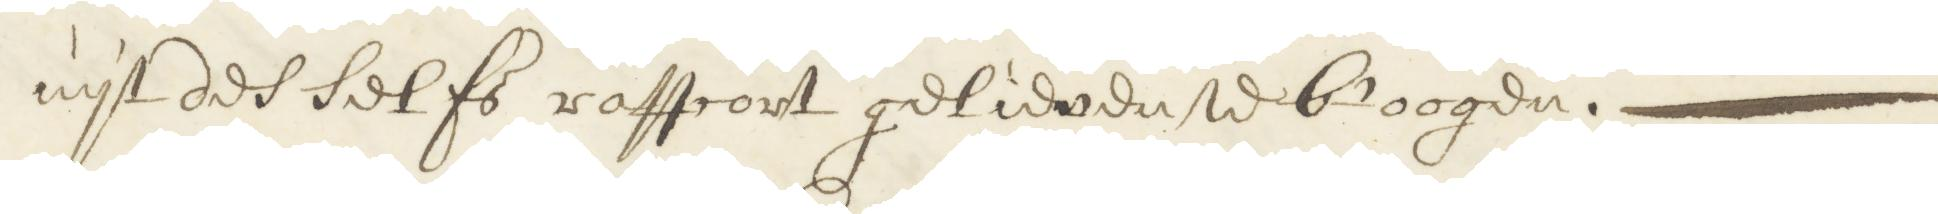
uijt des selfs rapport gelieven te b'oogen. —
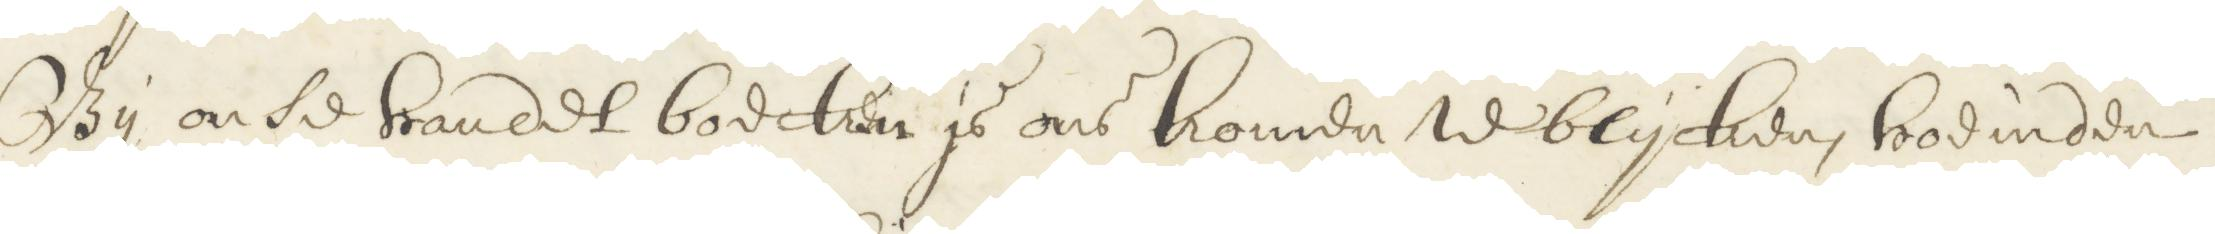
Bij onse handel boecken js ons komen te blijcken, hoe inden
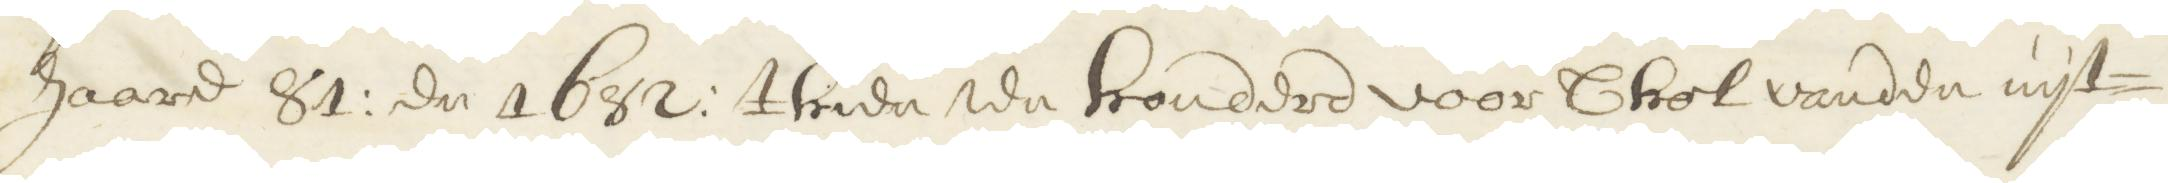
Jaare 81: en 1682: thien ten honderd voor thol vanden uijt„
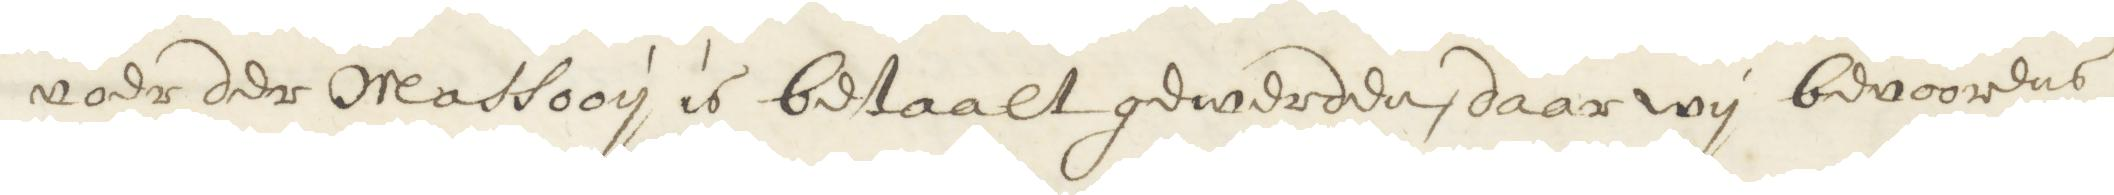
voer der Massooij is betaalt gewerden, daar wij bevoorens
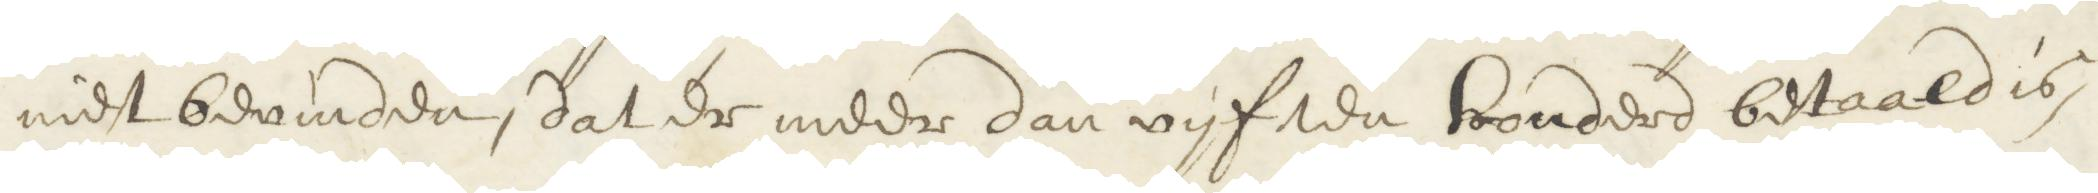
niet bevinden, dat 'er meer dan vijf ten honderd betaald is,
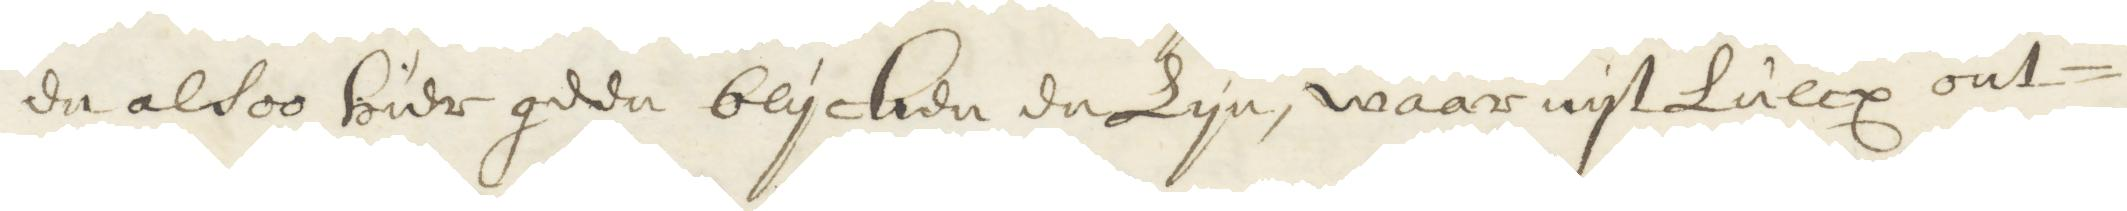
en alsoo hier geen blijcken en zijn, waar uijt zulcx ont„
